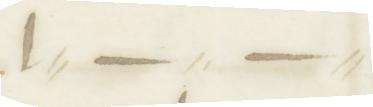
1„ —„—„
